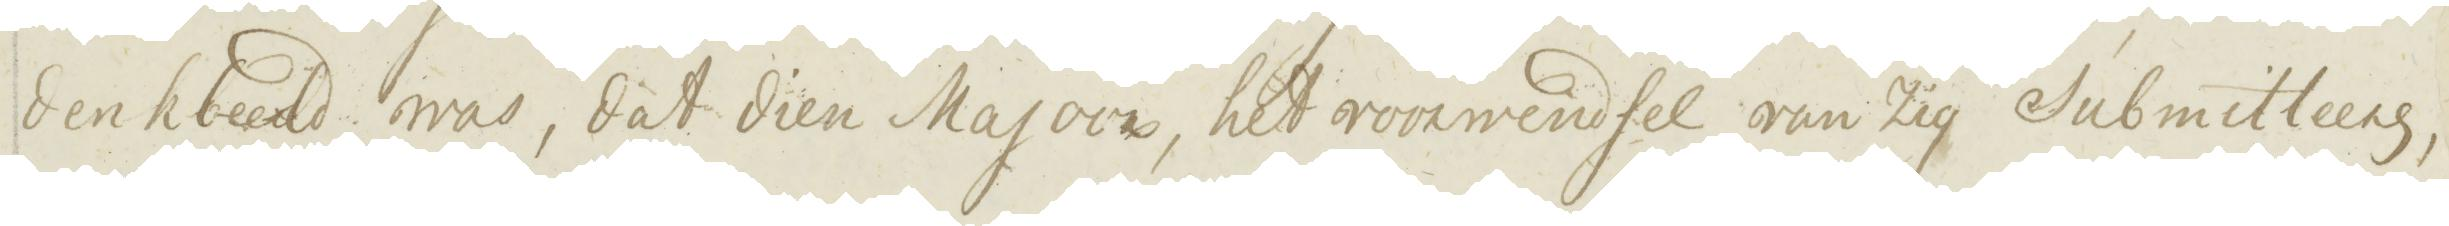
denkbeeld: was, dat dien Majoor, het voorwendsel van zig submitteeren,
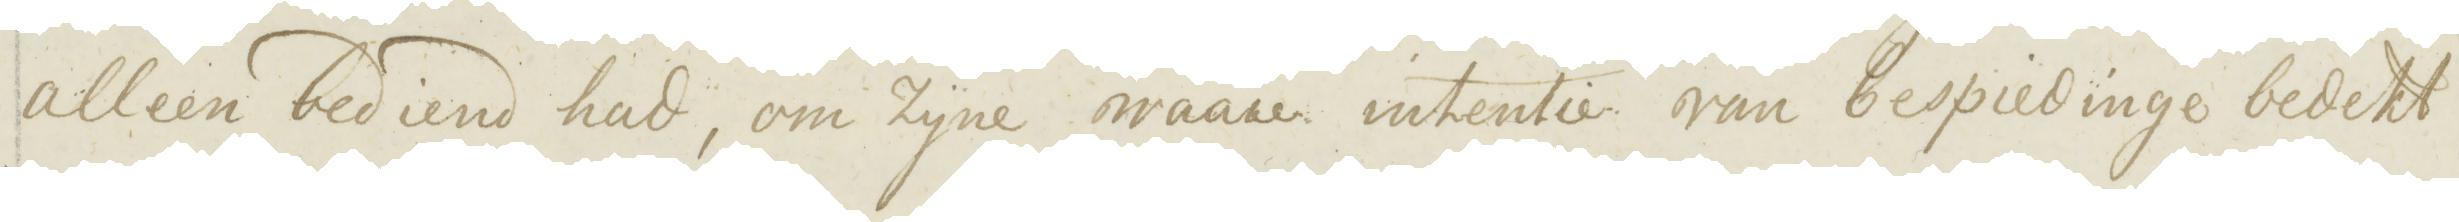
alleen bediend had, om zijne waare intentie van bespiedinge bedekt
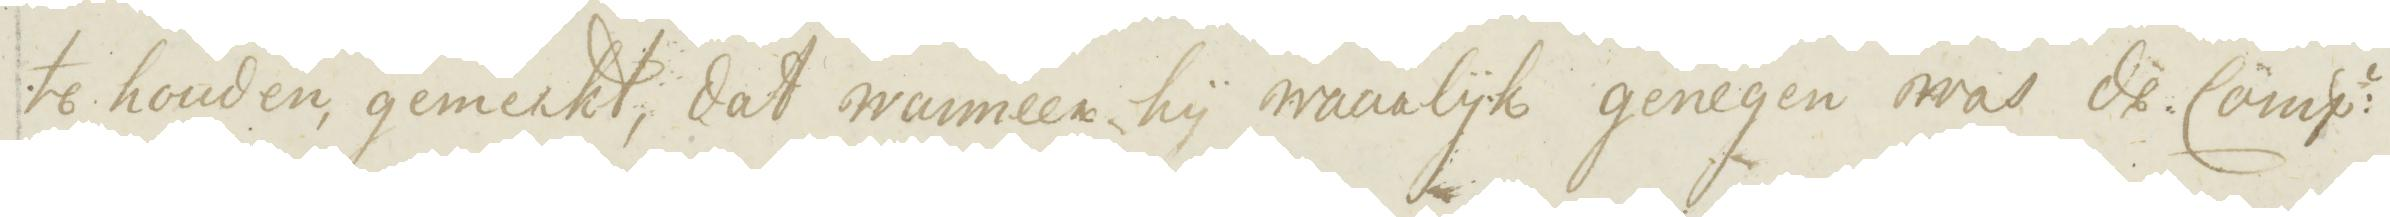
te houden, gemerkt, dat wanneer hij waarlijk genegen was de Comp:e
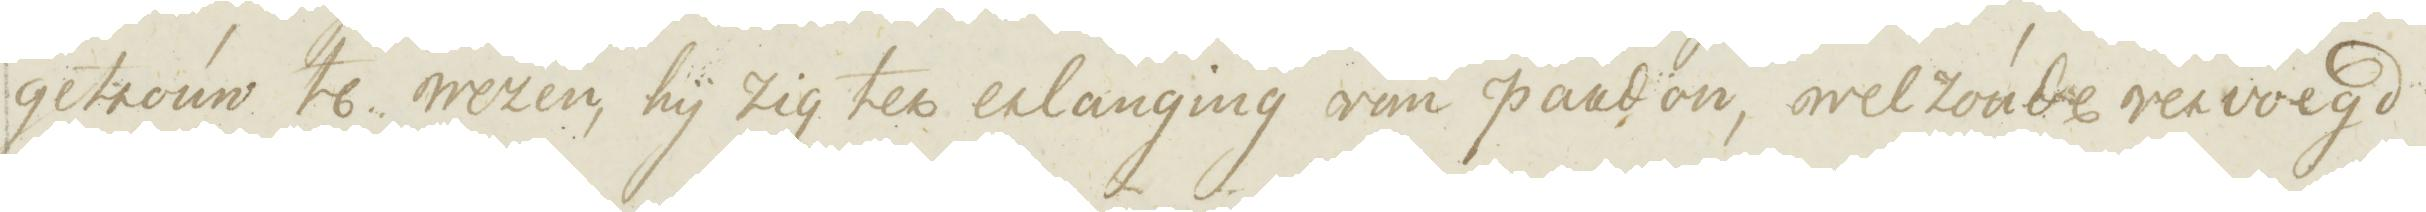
getrouw te wezen, hij zig ter erlanging van pardon, wel zoude vervoegd
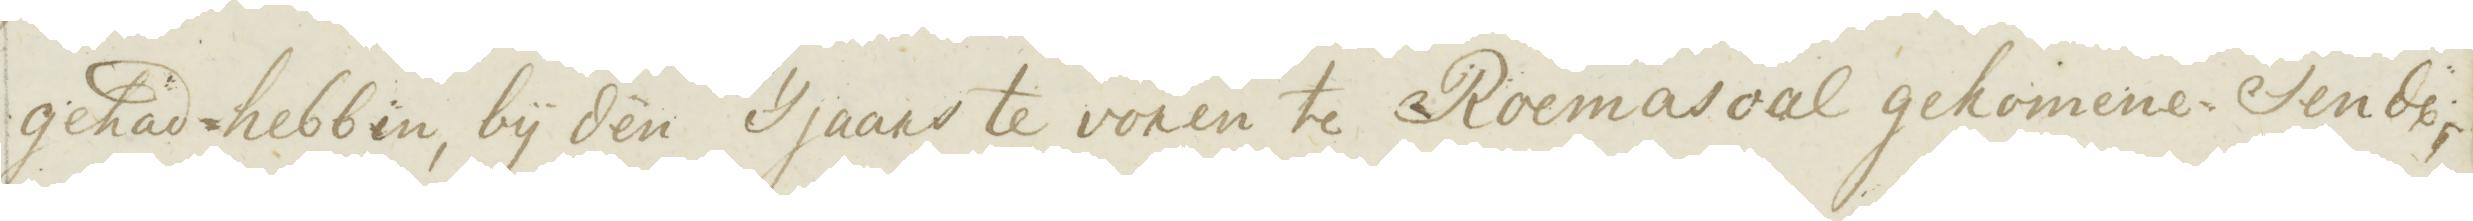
gehad=hebben, bij den 's jaars te voren te Roemasoal gekomene Sende„
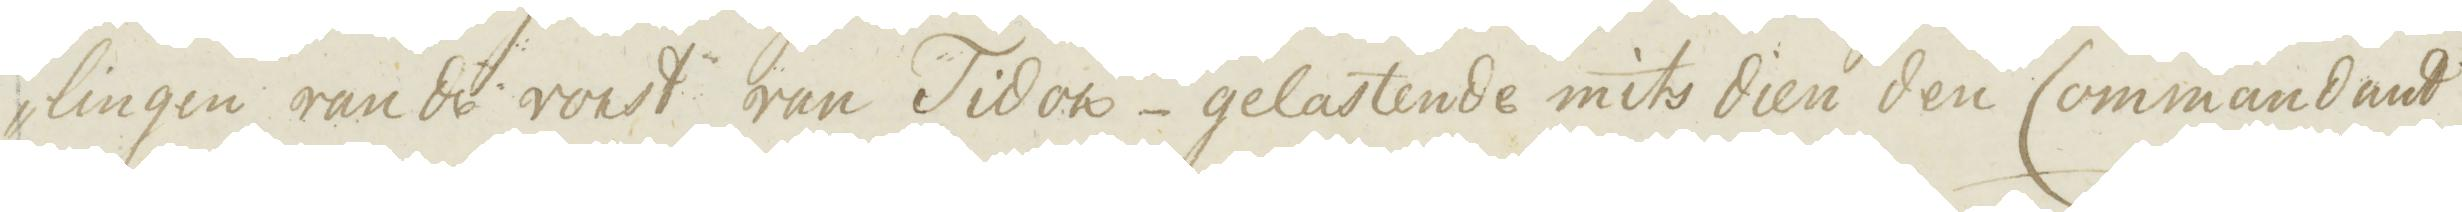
„lingen van de vorst van Tidor - gelastende mits dien den commandant
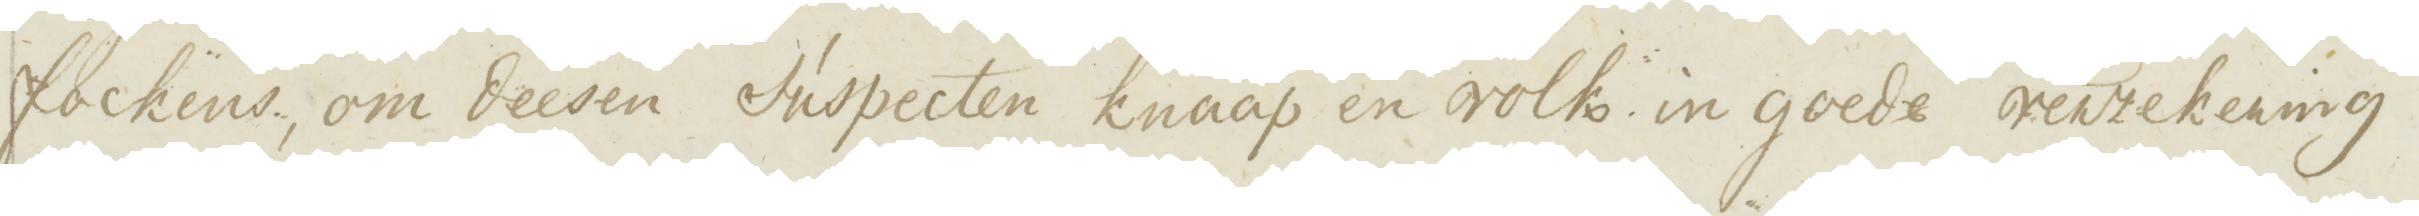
fockens, om deesen suspecten knaap en volk in goede verzekering
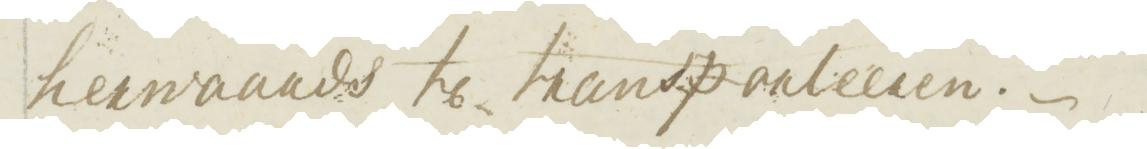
herwaards te transporteeren.—
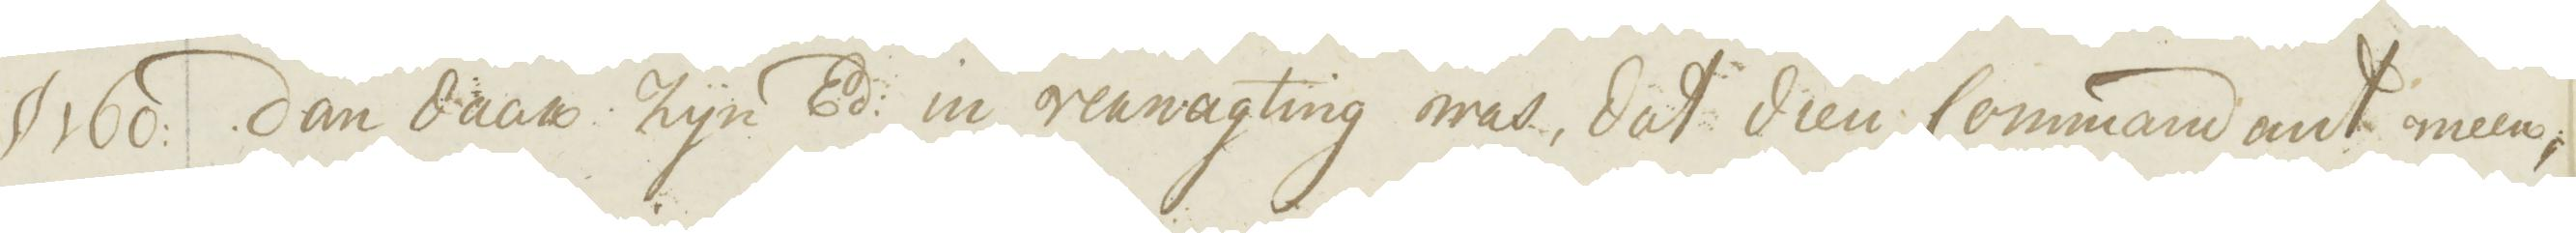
§ 160: dan daar zijn Ed: in verwagting was, dat dien commandant meer„
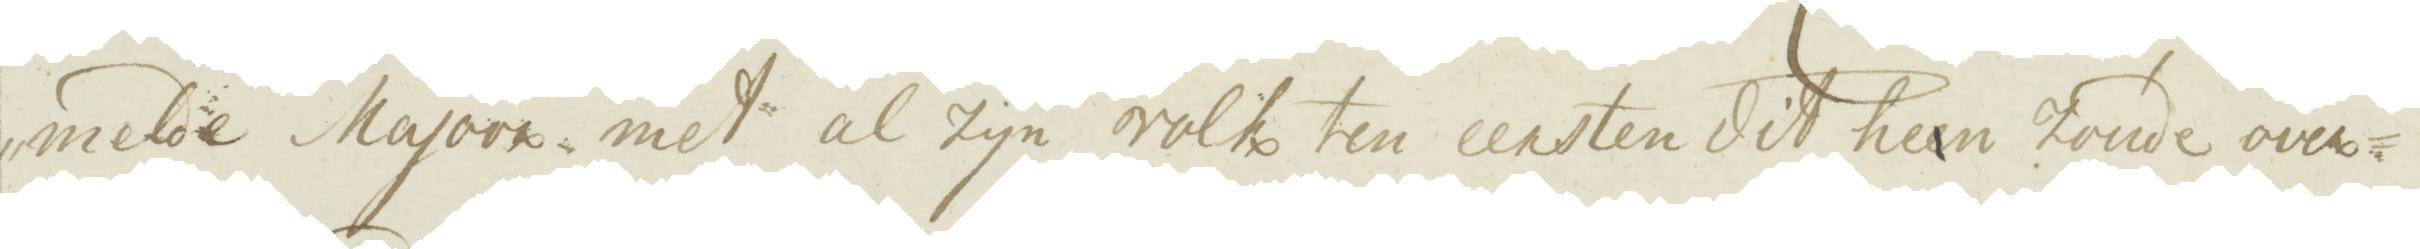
melde Majoor, met al zijn volk ten eersten dit heen zoude over=
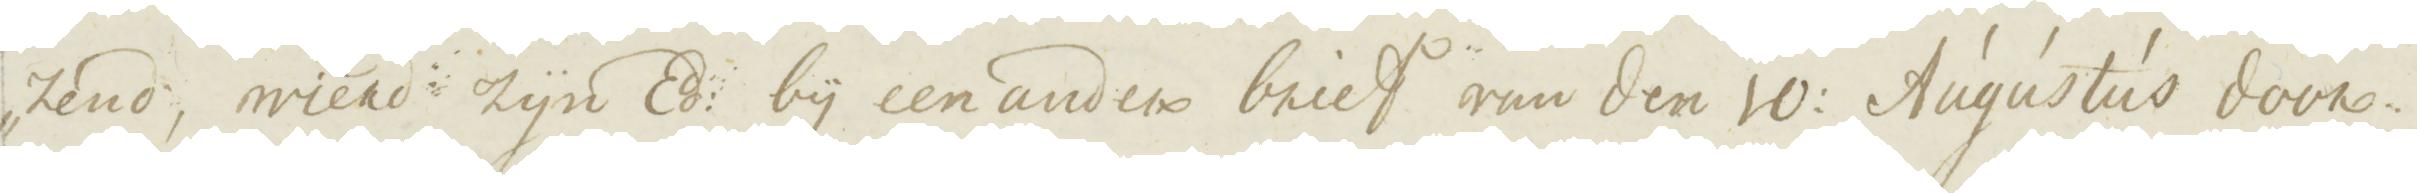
„zend, wierd zijn Ed: bij een andere brief van den 10: Augustus door
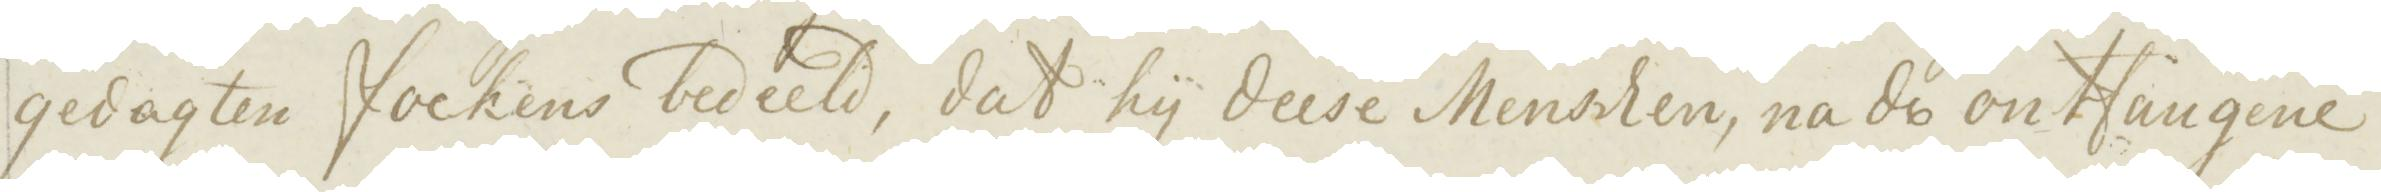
gedagten fockens bedeeld, dat hij deese Menschen, na de ontfangene
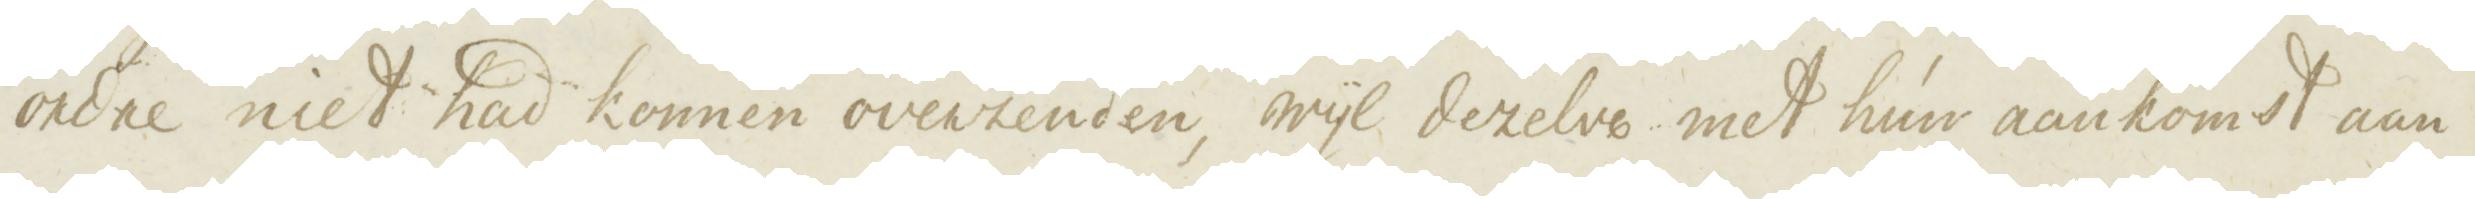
ordre niet had konnen overzenden, wijl dezelve met hun aan komst aan
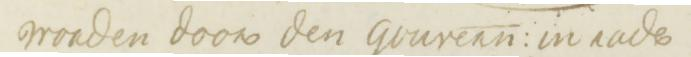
worden door den gouvern: in rade
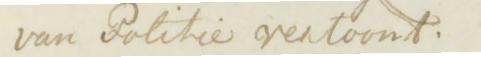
van Politie vertoont.
